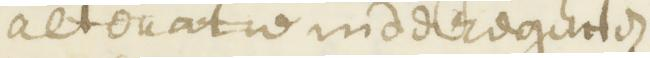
alteratie in de regenten
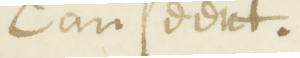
causeert.
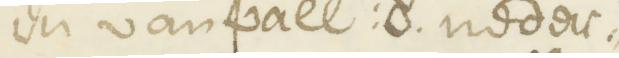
en van pall: 8. neder„
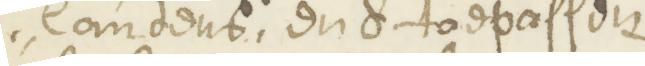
„landers, en 8 toepassen
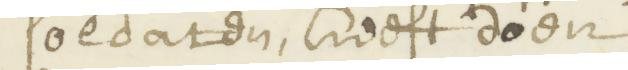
soldaten, heeft doen
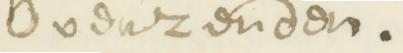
Overzenden.
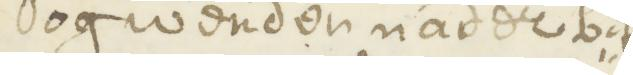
dog werden nader be„
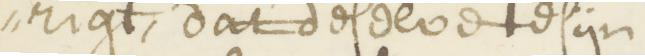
„rigt, dat deselve te sijn
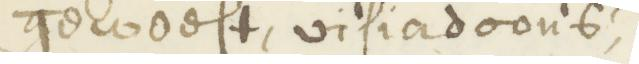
geweest, visiadoors,
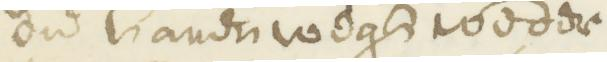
die haren wegh weder
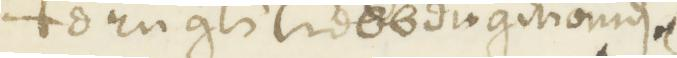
te rugt hebben genomen.
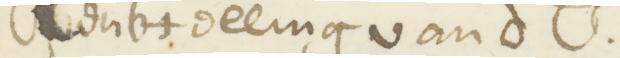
Aen stelling van d’ E.
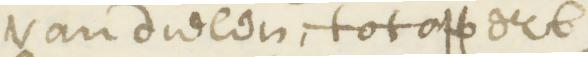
van dielen; tot opperb
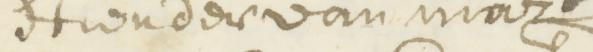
stierder van mar
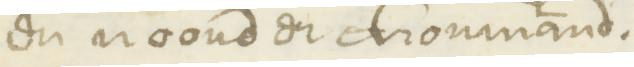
en noorder chormand.
